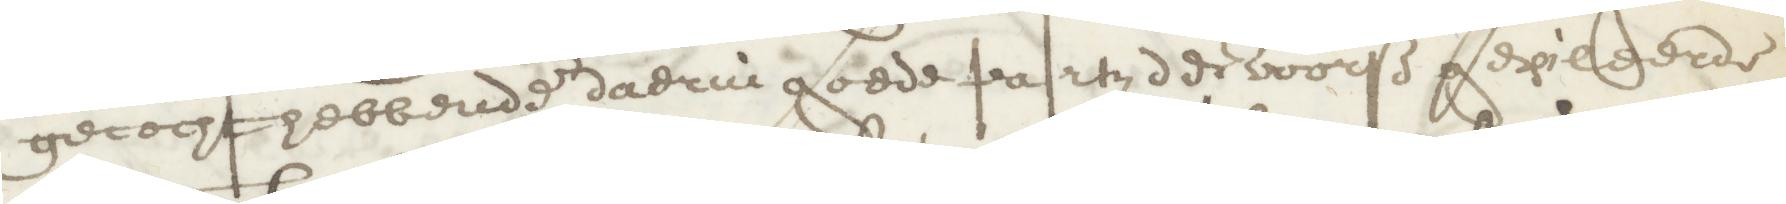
gecocht hebbende daerin goede party der voorsz gepileerde
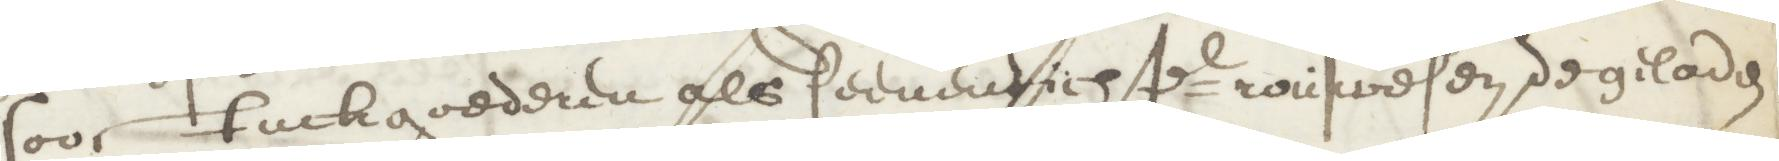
soo stuck goederen als seeuentich p=l rouwe seyde geladen
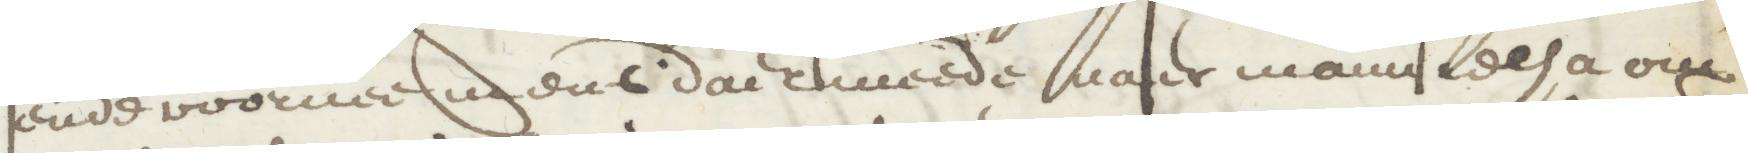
ende voornneement daermeede naer mamcelsa om
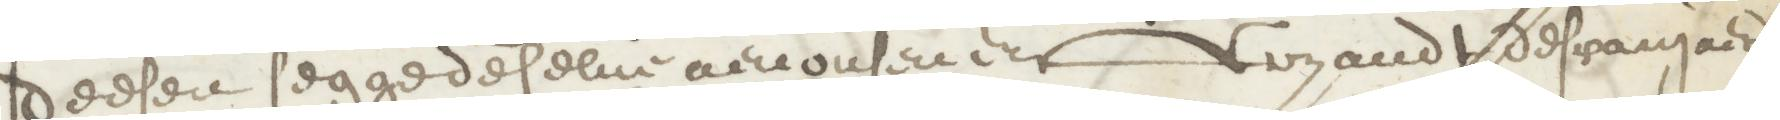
deesen segge deselve aen onsen erff vyandt despanjaerd
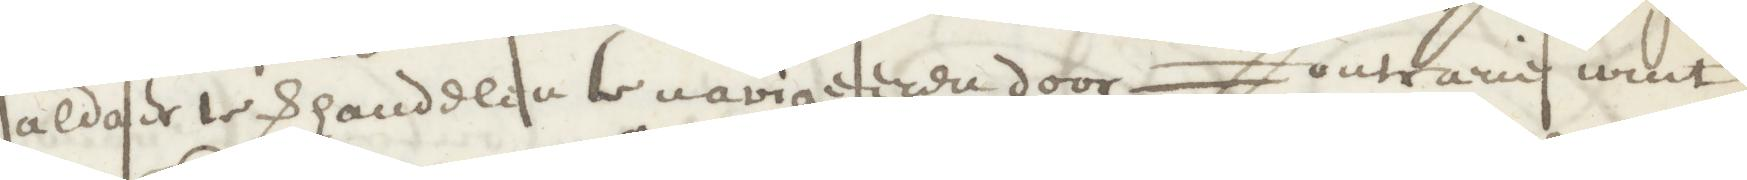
aldaer te verhandelen te navigeeren door Contrarie wint
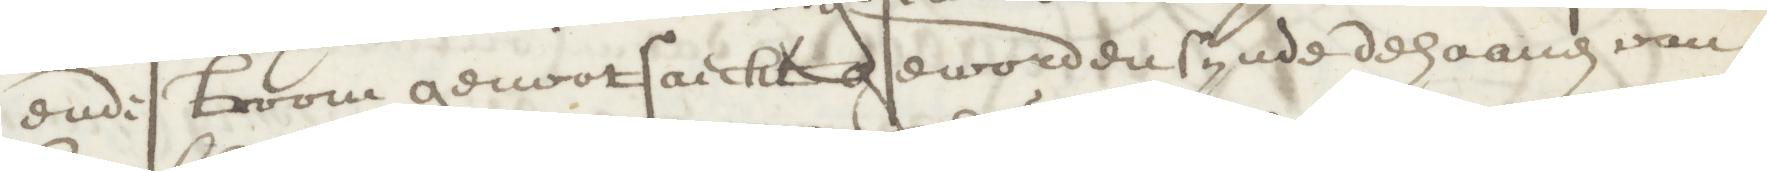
ende trouw genootsaeckt geworden synde dehaanen van
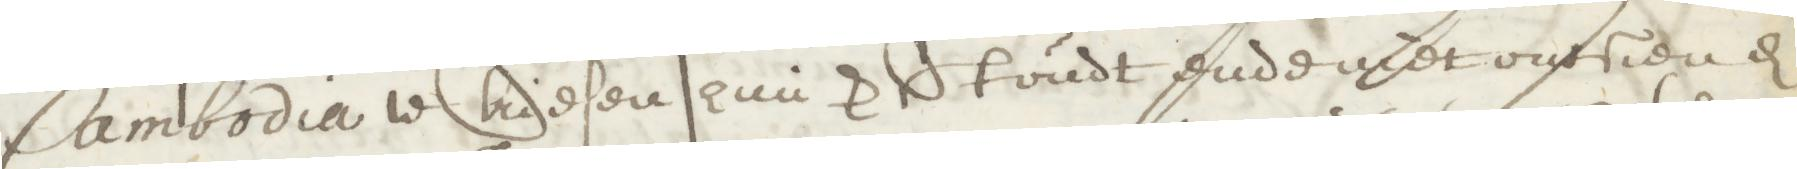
Cambodia te kiesen hun verstoudt ende niet ontsien en
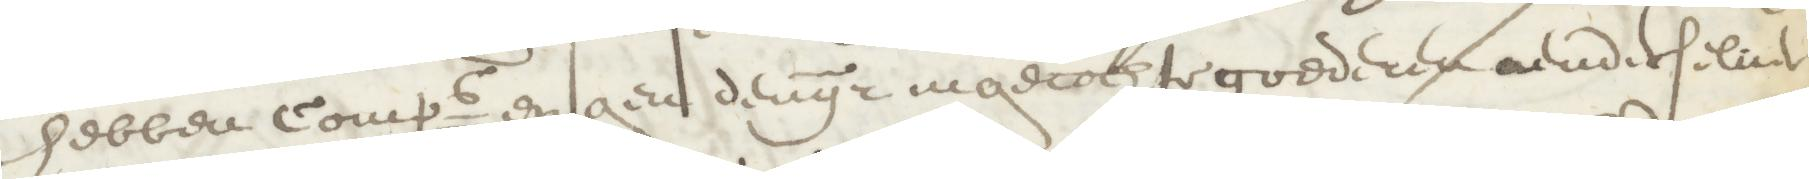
hebben Comp-s eygen denyr ingecochte goederen aen deselve
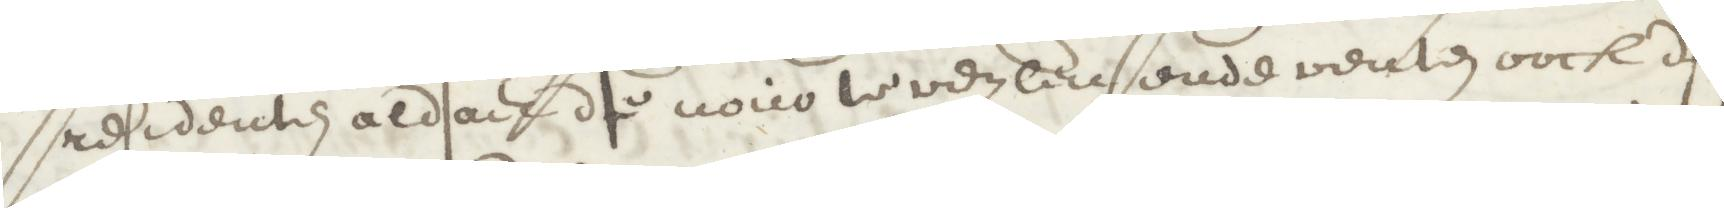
residenten aldaer de nouo te veylen ende venten oock de
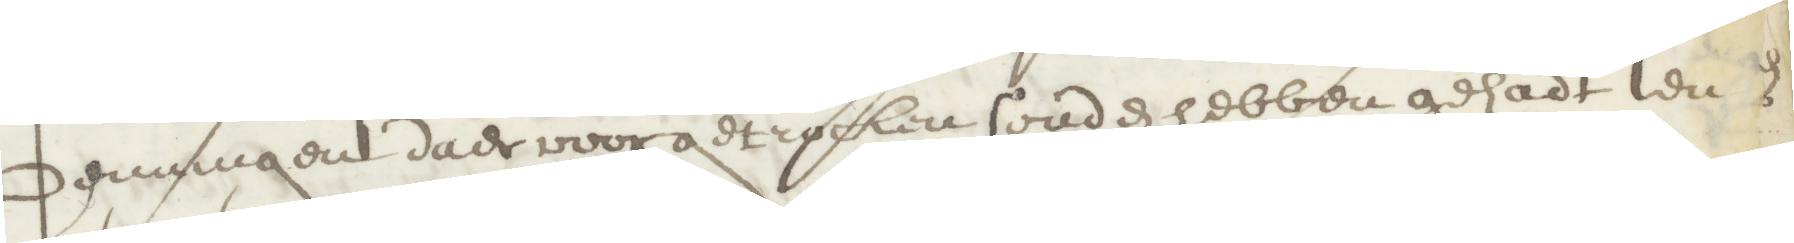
Penningen daer voor getrocken souden hebben gehadt ten
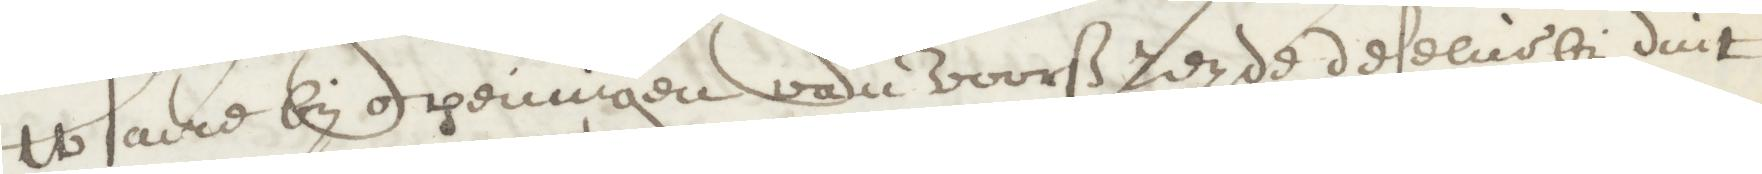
waere bij openingen van voorsz reyde deselue bij duit
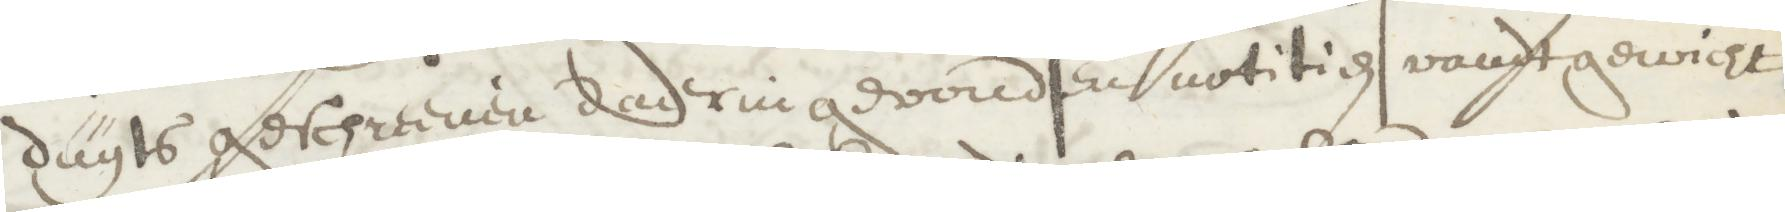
duijts geschreven daerin gevonden notitien vandt gewicht
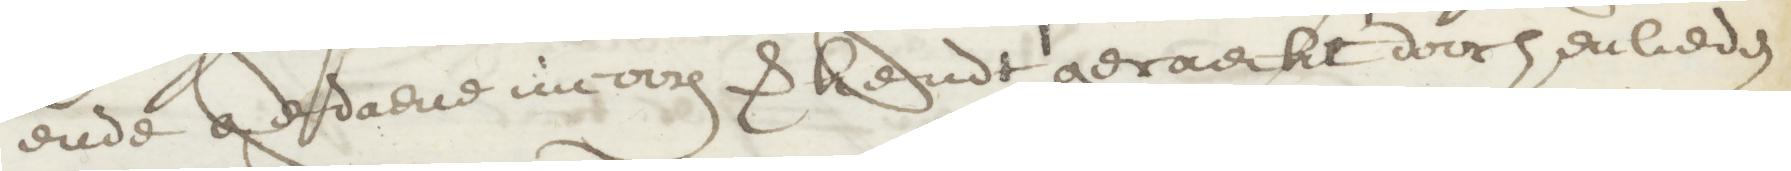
ende aesdaene incoop verkendt geraeckt door henlieden
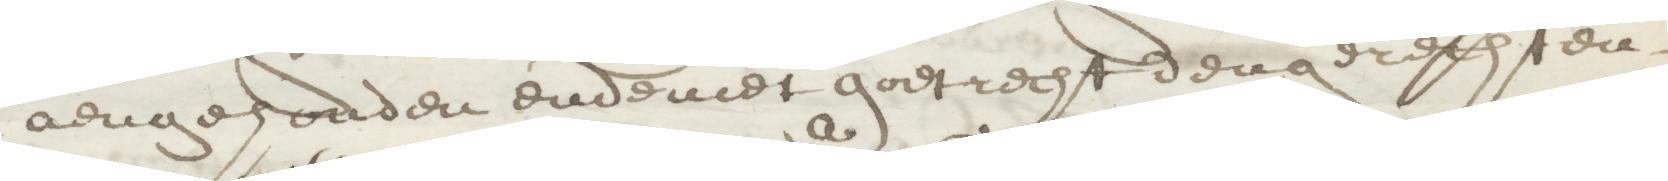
aengehouden ende met goet recht den gerechten
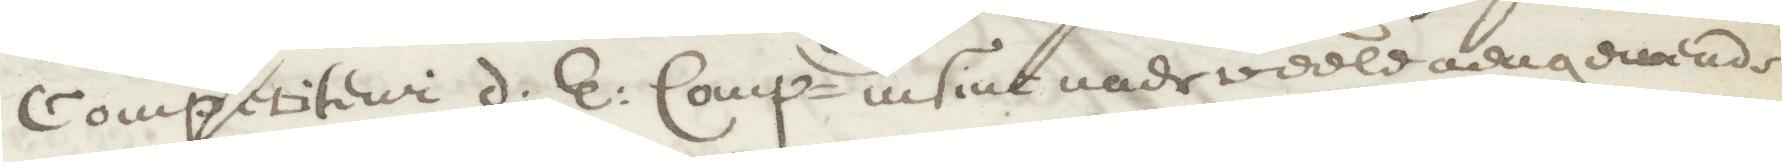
Competiteur d: E: Comp=a in sint naer veele aengewende
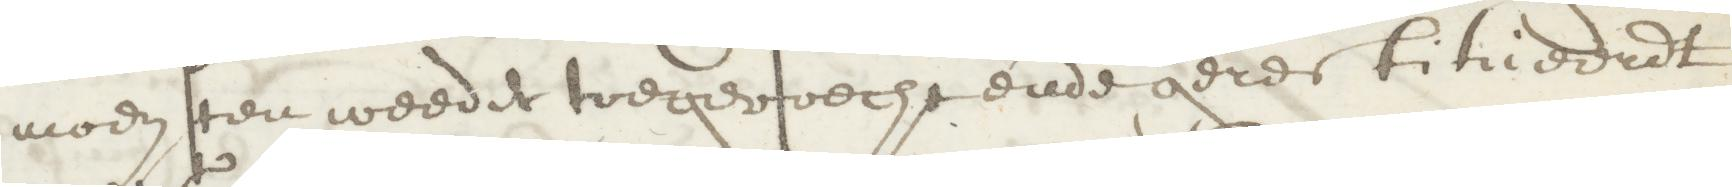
moeyten weeder toevervoecht ende gerestitueerdt
